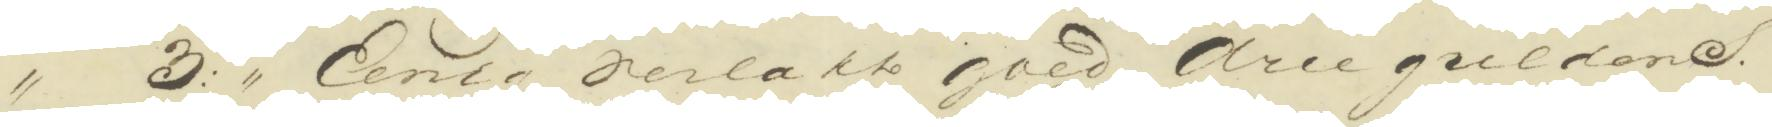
„ 3: „ Eenig verlakt goed, drie guldens.
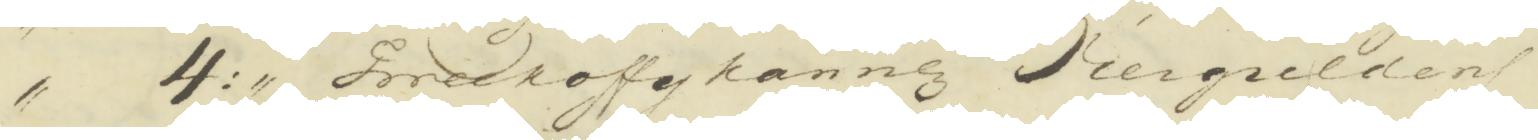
„ 4:„ Twee koffykannen Vier guldens
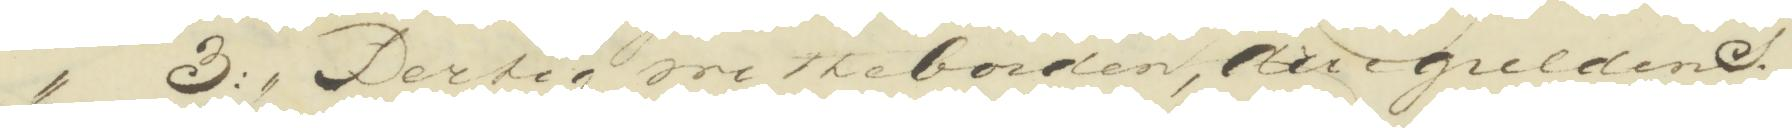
„ 3:„ Dertig witte borden, drie guldens.
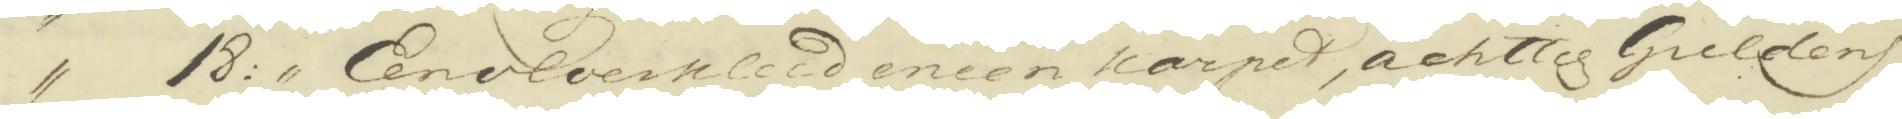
„ 18: „ Een vloerkleed en een karpet, achttien Guldens
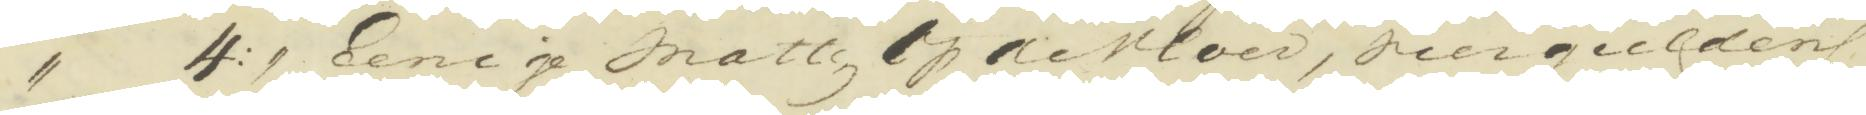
„ 4:„ Eenige matten op de vloer, vier guldens
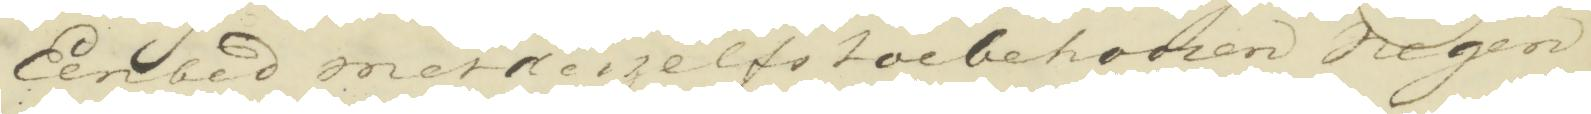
Een bed met derzelfs toebehooren negen
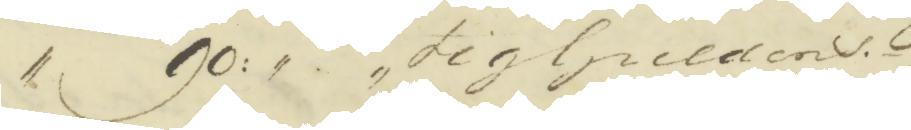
„ 90:„. „tig Guldens.
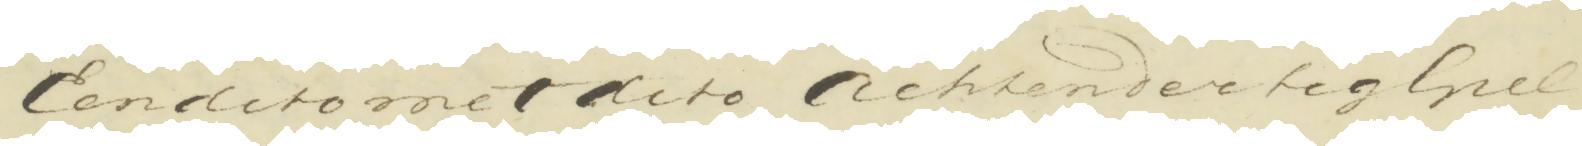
Een dito met dito Achtendertig Gul
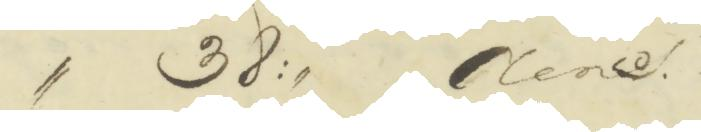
„ 38:„ dens.
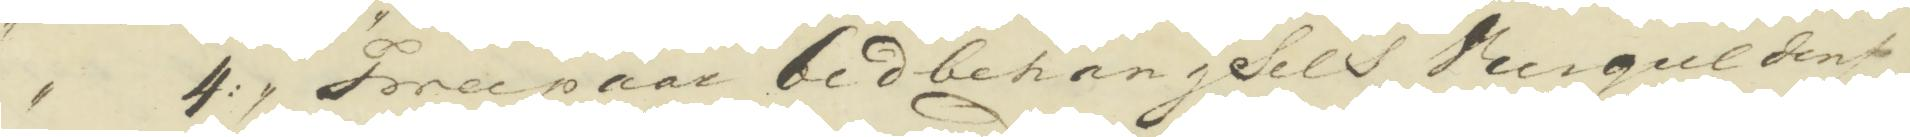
„ 4:„ Twee paar bedbehangsels Vier guldens
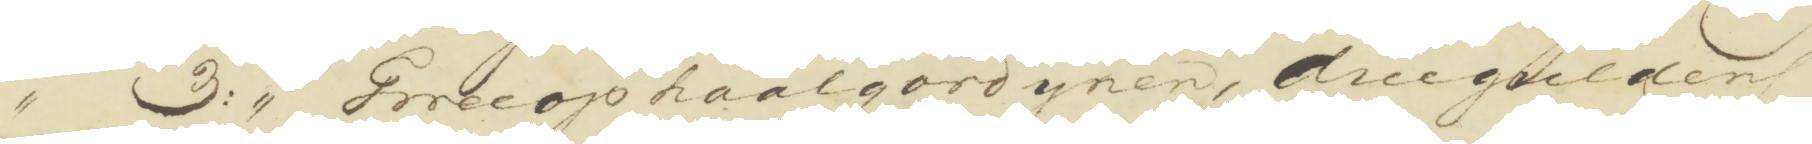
„ 3: „ Twee op haalgordynen, drie guldens
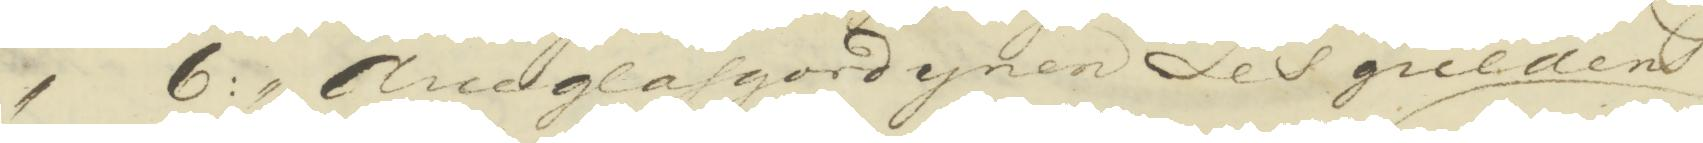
„ 6: „ drie glasgordynen Zes guldens
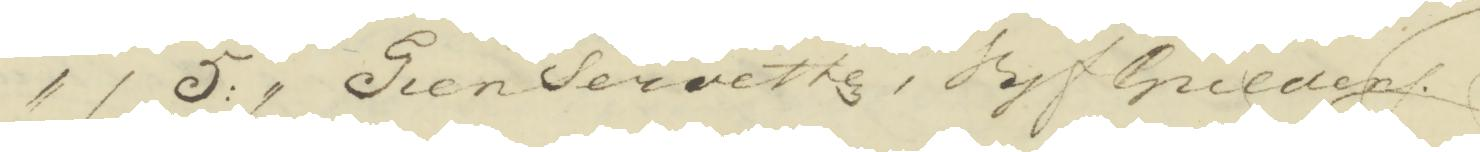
„ 5: „ Tien servetten, Vyf Guldens.
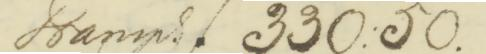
Transp.en ƒ 330:50.
